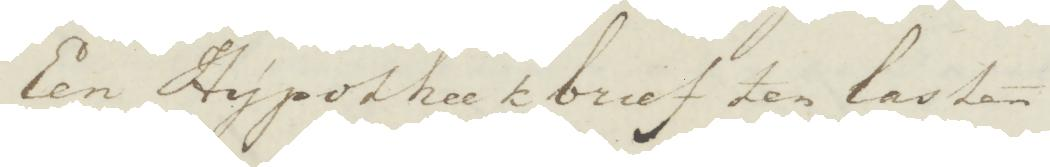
Een Hijpotheekbrief ten lasten
